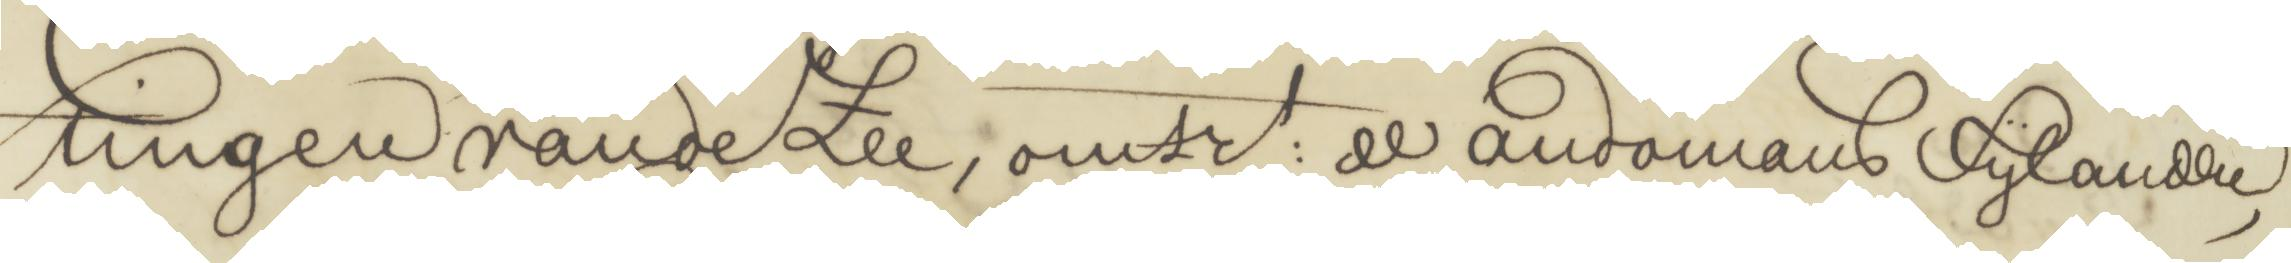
tingen van de Zee, omtr:t de andomans Eijlanden,
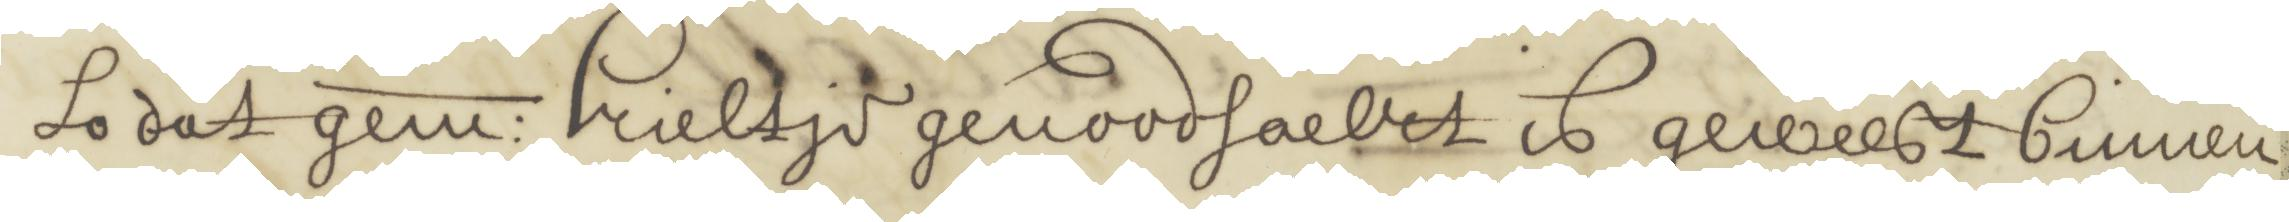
so dat gem: kieltje genoodsaekt is geweest binnen
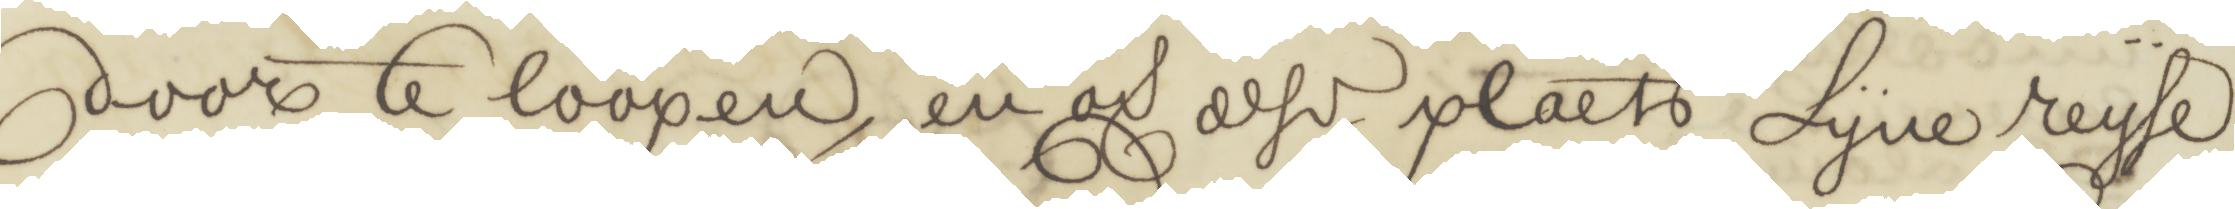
door te loopen, en over dese plaets sijne reijse
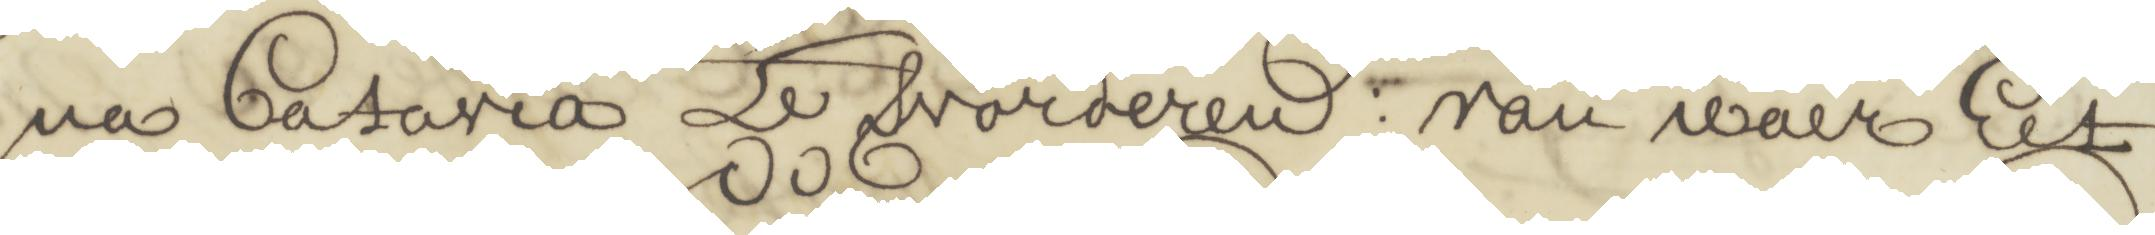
na batavia te vervorderen: van waer het
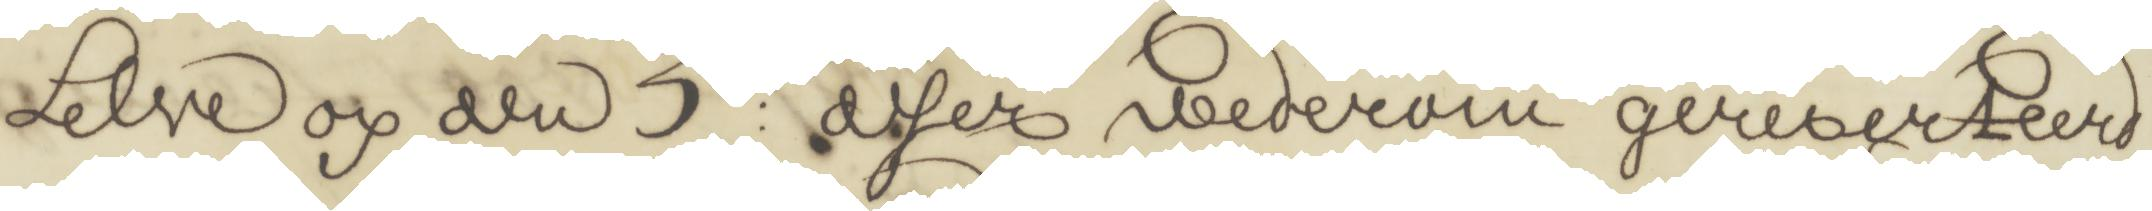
selve op den 5':' deser wederom gereverteerd,
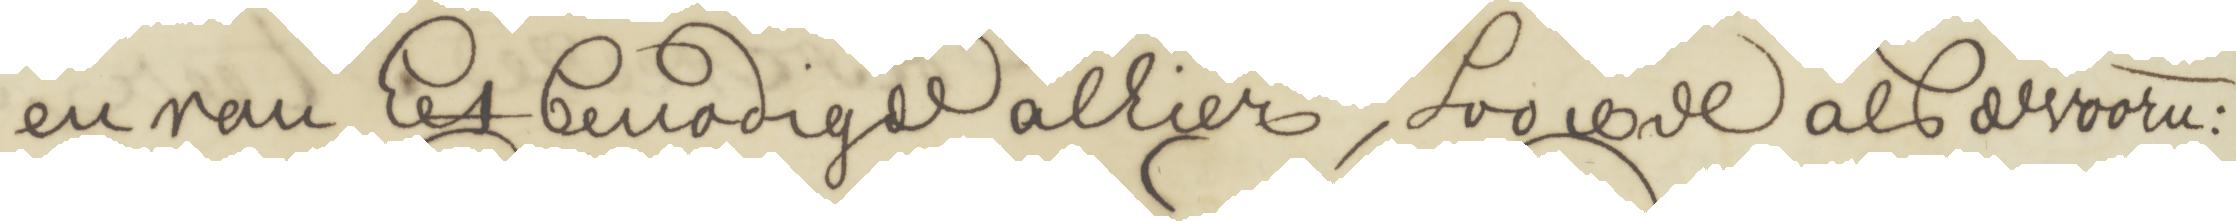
en van het benodigde alhier, soo wel als devoorn:
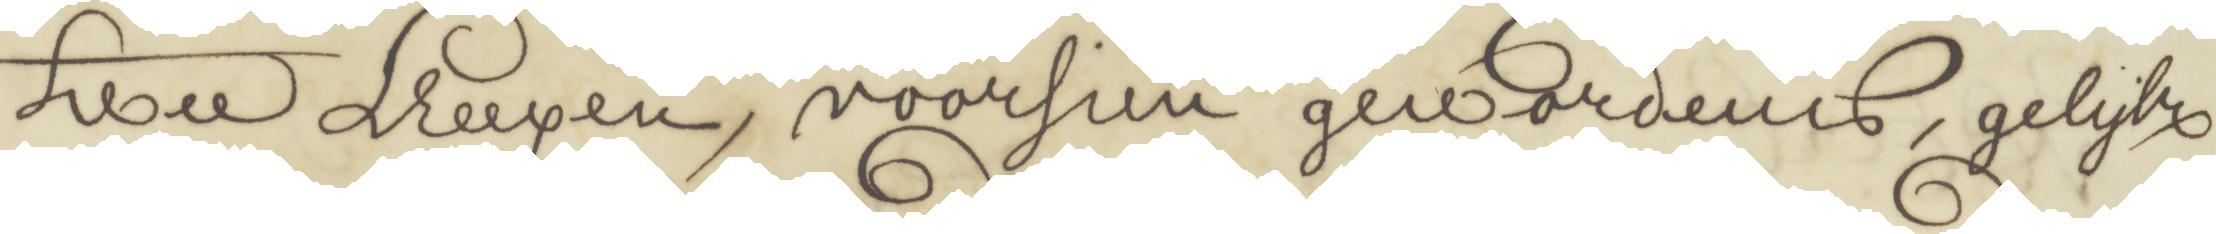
twee scheepen, voorsien geworden is, gelijk
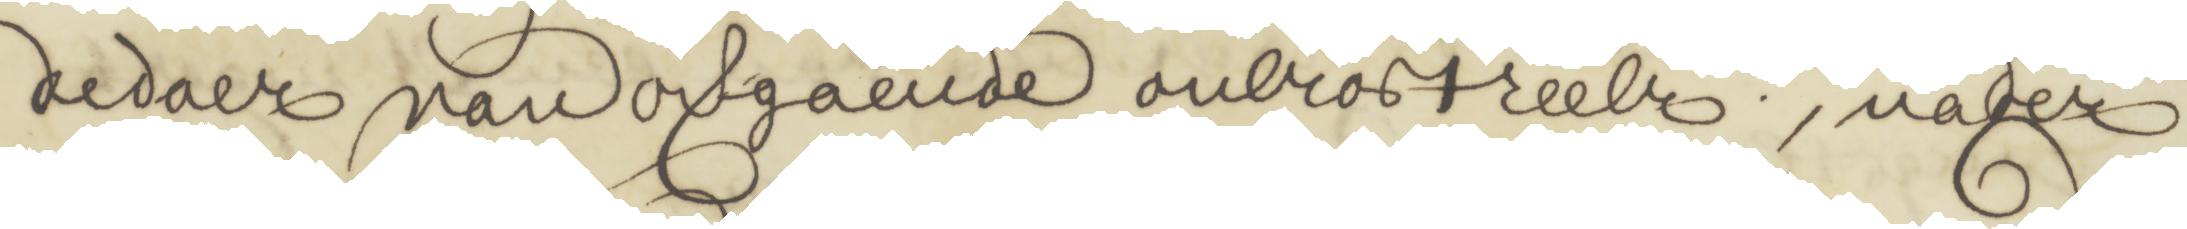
de daer van overgaende onkostreek:, nader
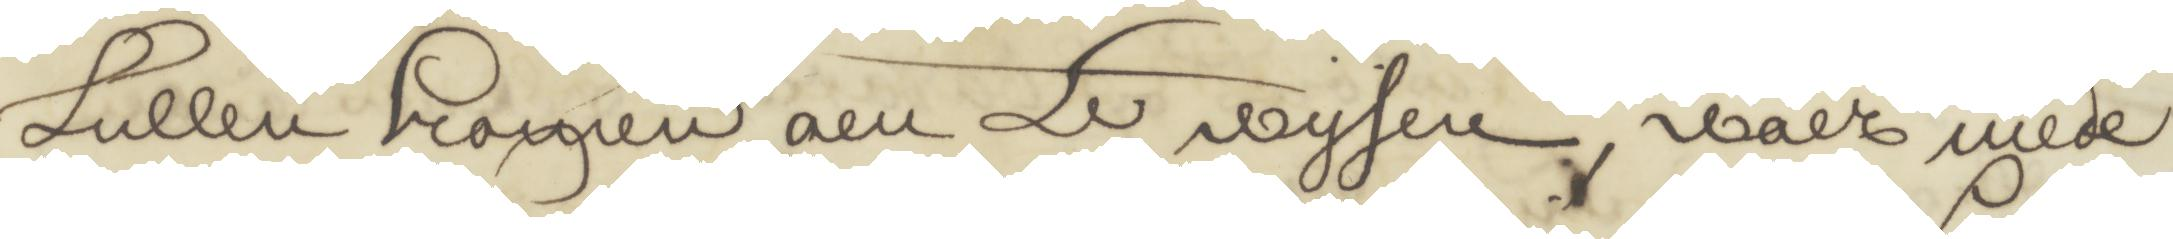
sullen komen aen te wijsen, waer mede
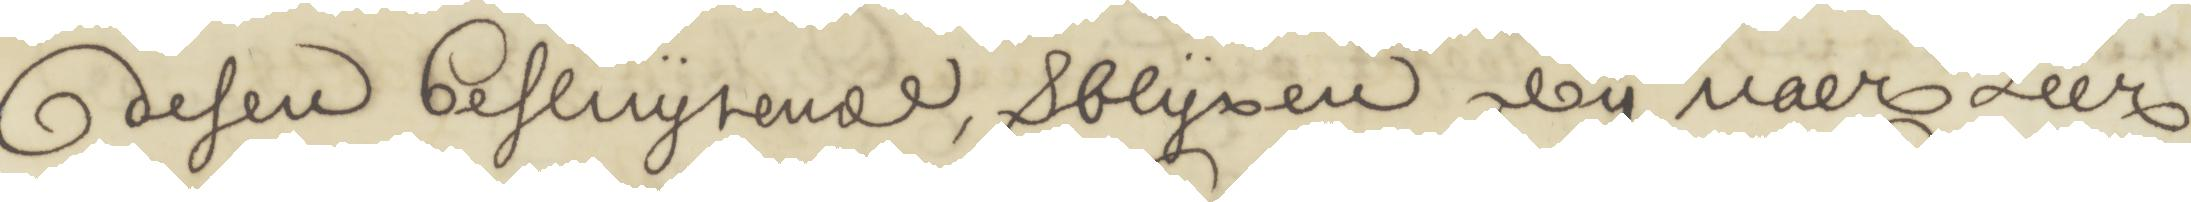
desen besluijtende, verblijven wij naer seer
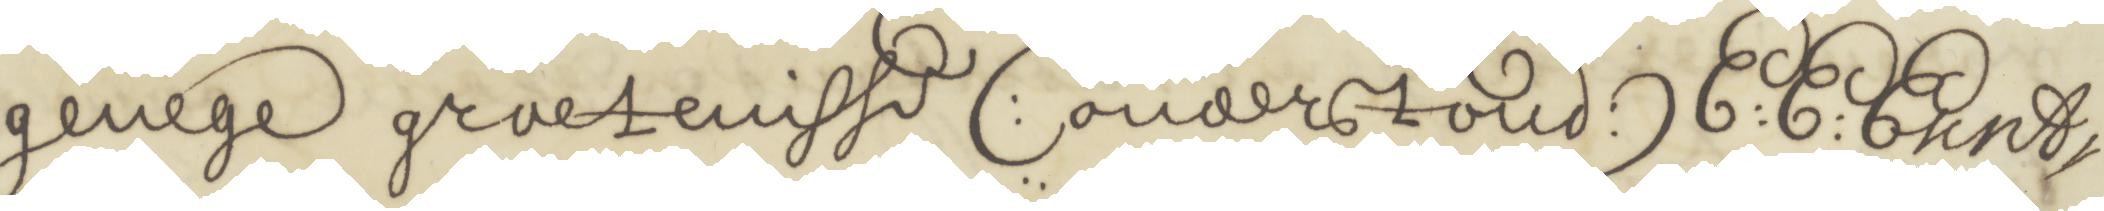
genege groetenisse (:onderstond:) E: E: Ernt„
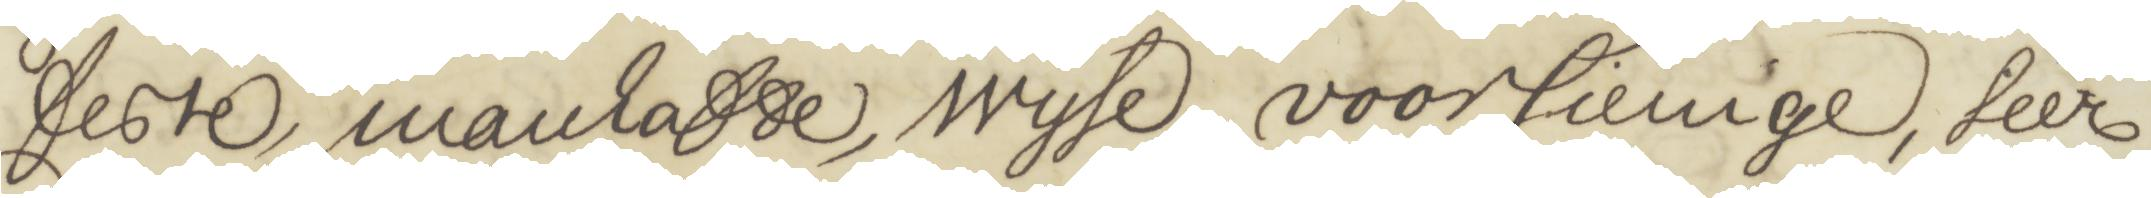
feste, manhafte, wijse, voorsienige, seer
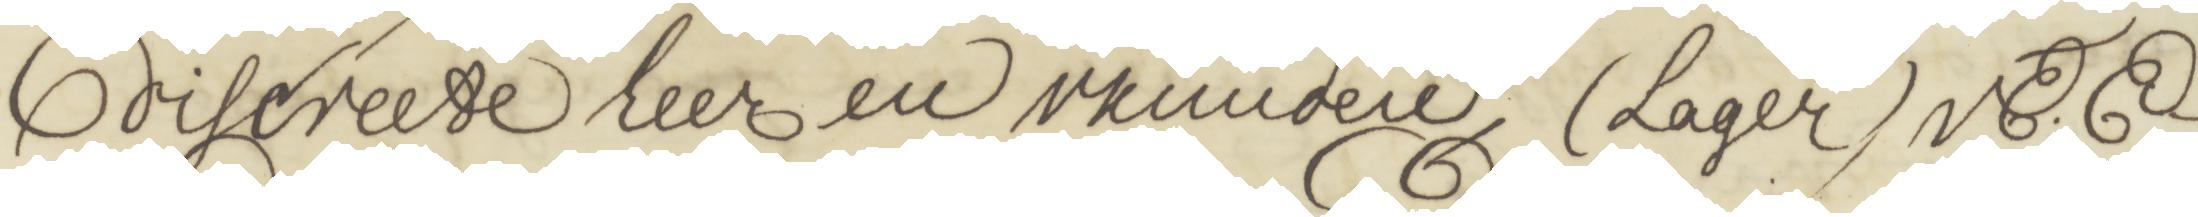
discreete heer en vrunden, (lager) VE: E=
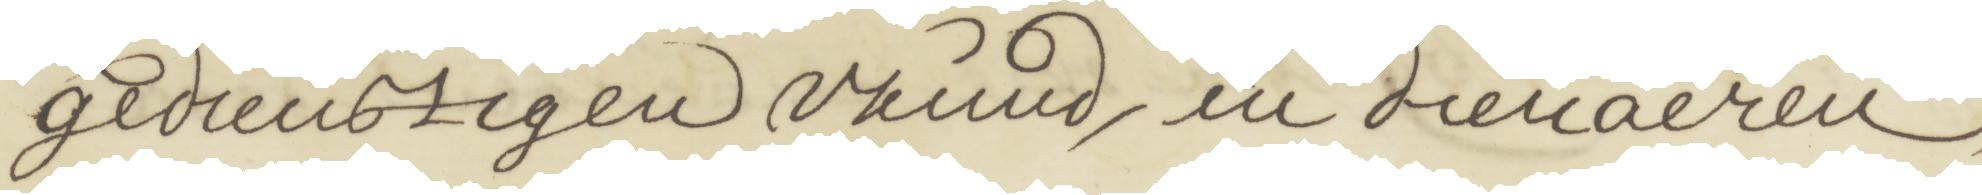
gedienstigen vrund, en dienaeren
